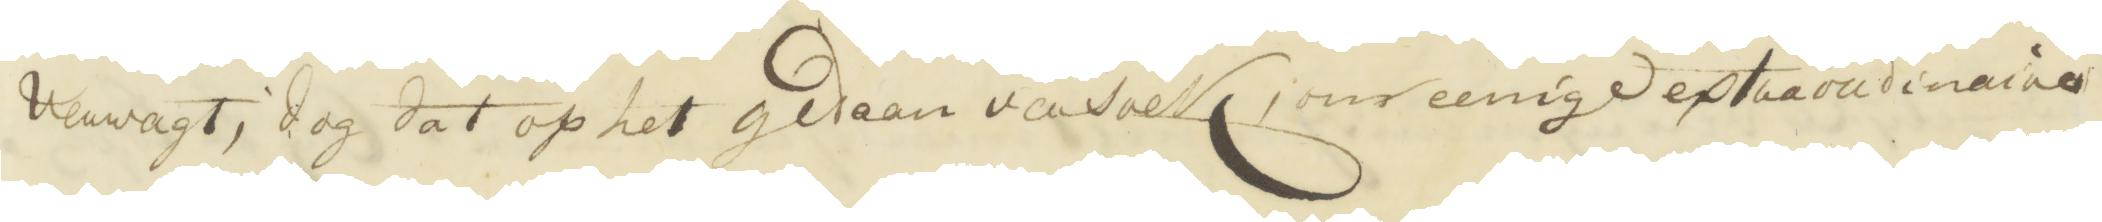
verwagt; dog dat op het gedaan versoek; om eenige extraordinaire
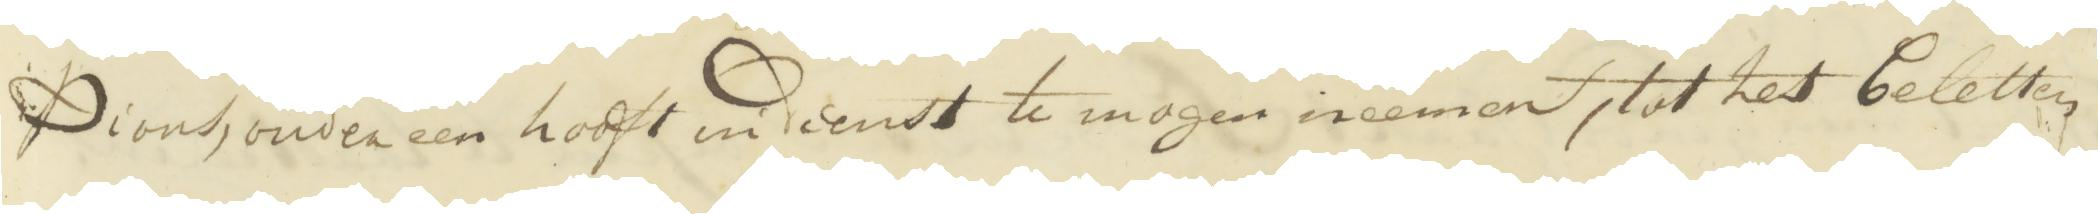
Pions, onder een hooft indienst te mogen neemen, tot het beletten
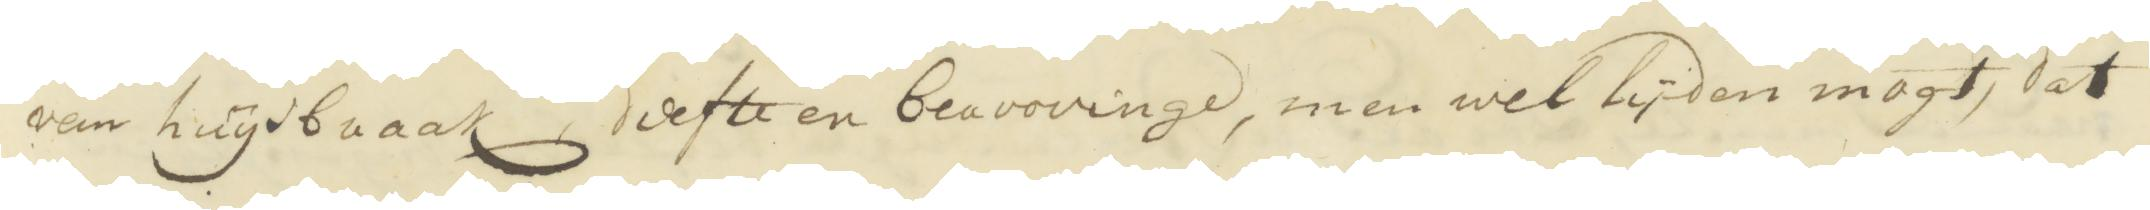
van huijsbraak diefte en beroovinge, men wel lijden mogt, dat
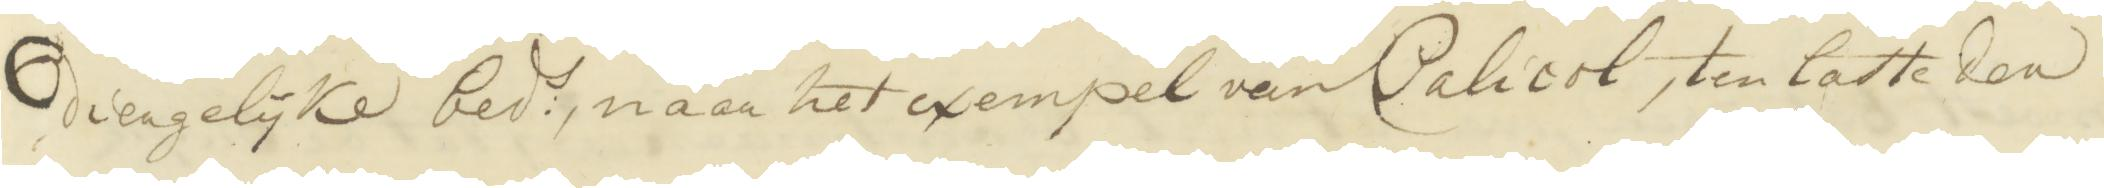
diergelijke bed:s, naar het exempel van Palicol, ten laste der
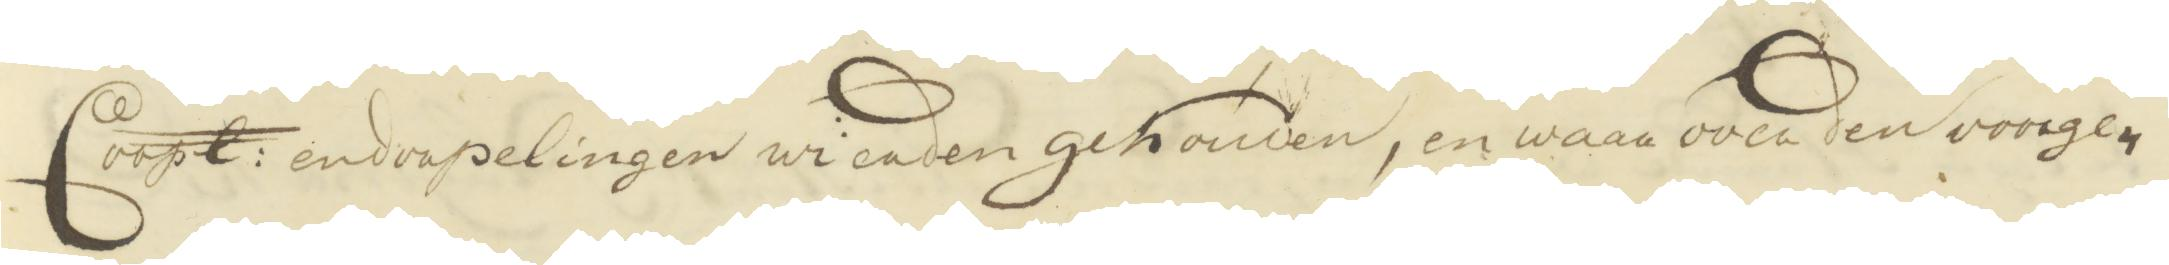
Coopl: en dorpelingen wierden gehouden, en waar over den voorge„
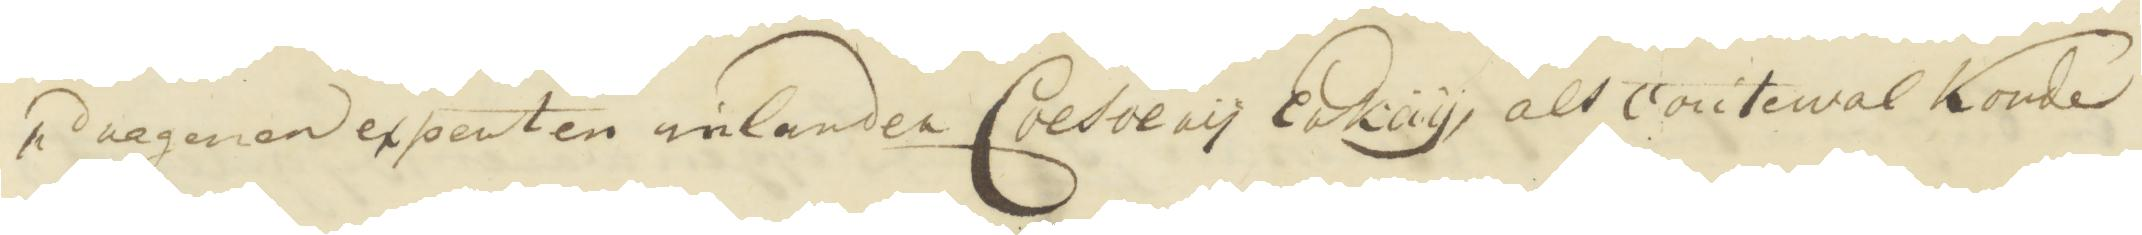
dragenen experten inlander Coesoerij Erkaij, als coutewal Konde
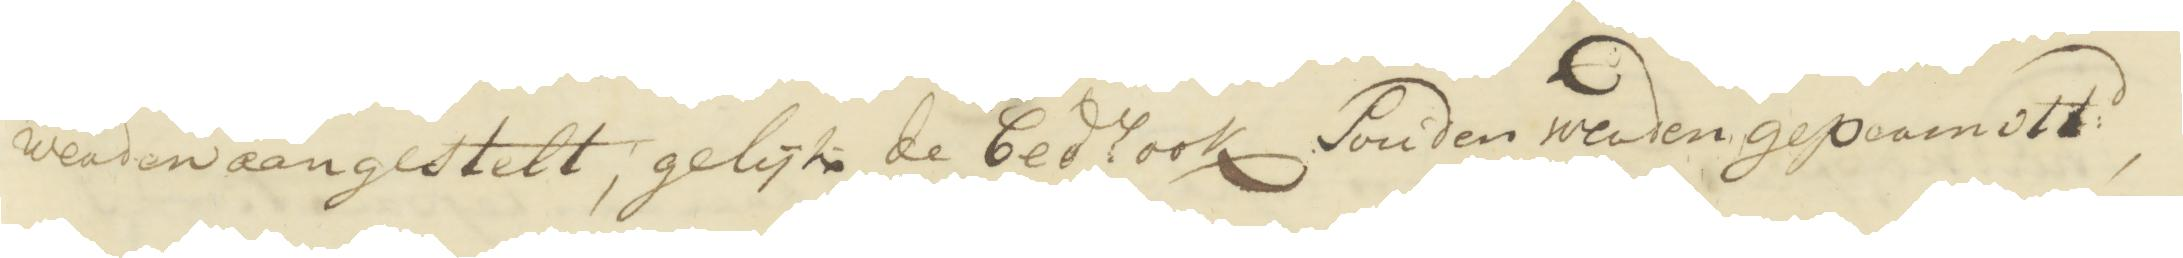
werden aangestelt; gelijk de bed:s ook Souden werden gepermitt:d,
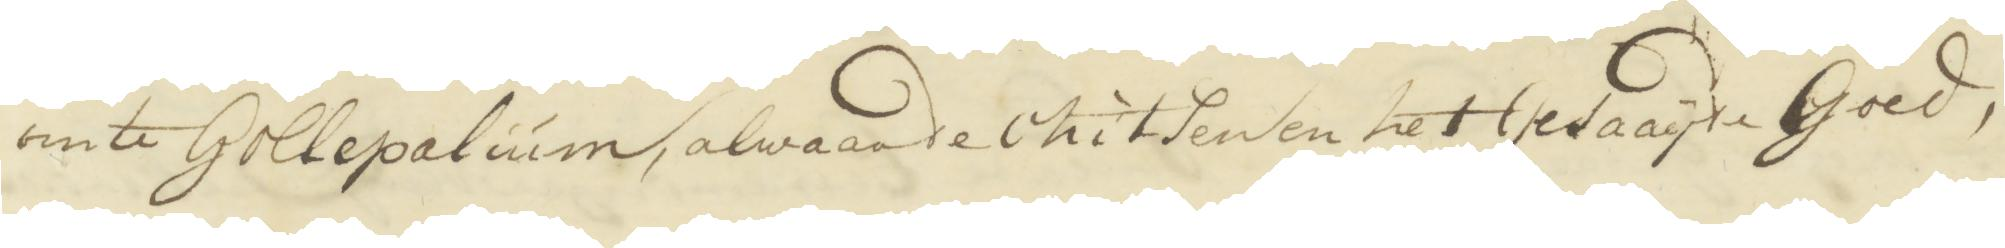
om te Gollepalium, alwaar de chitsen en het Gesaaijde Goed,
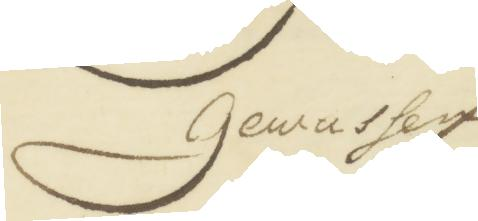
gewassen
